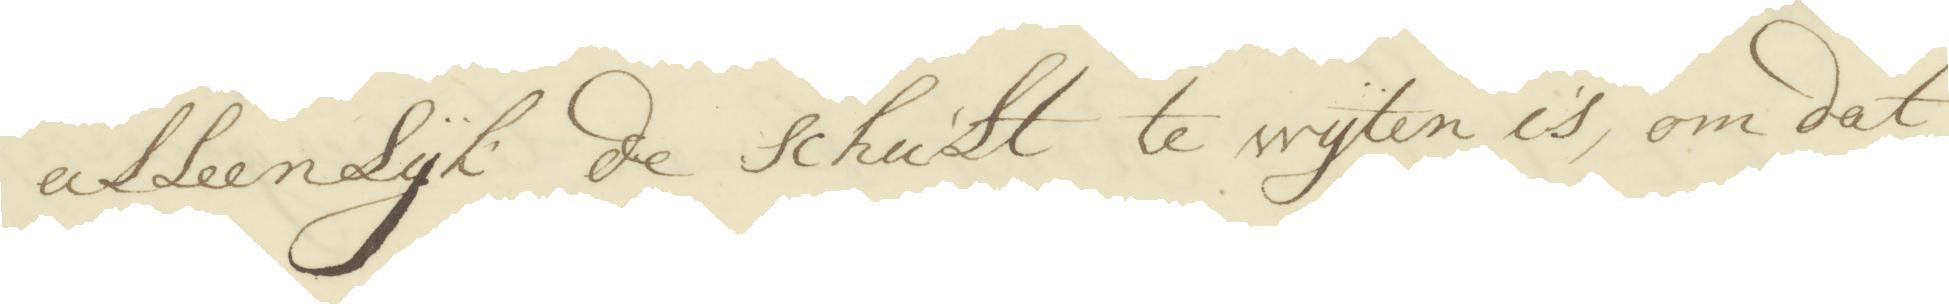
alleenlijk de schult te wijten is, om dat
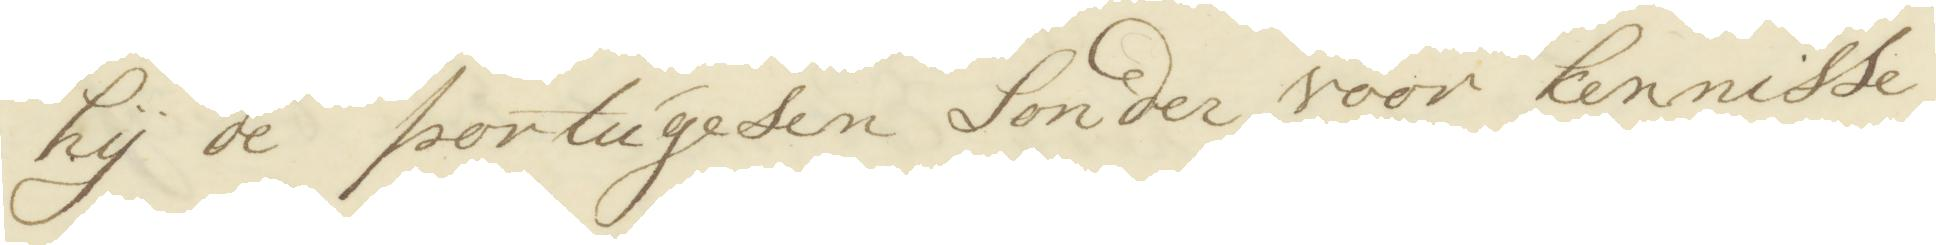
hij de portugesen sonder voor kennisse
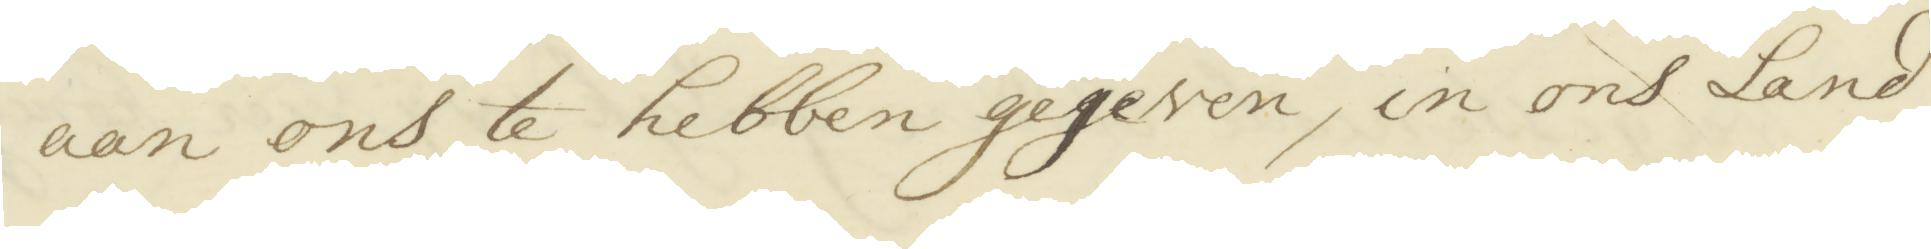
aan ons te hebben gegeven, in ons land
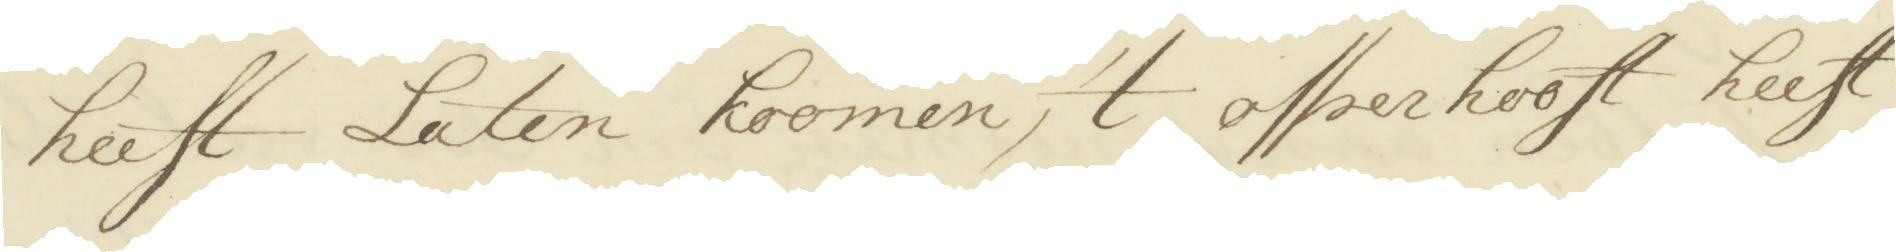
heeft laten koomen, ’t opperhooft heeft
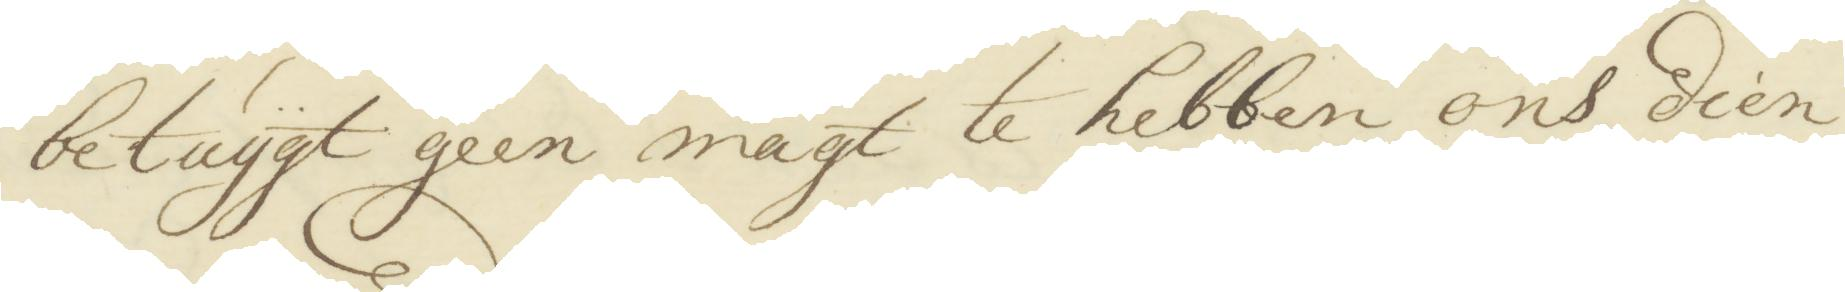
betuijgt geen magt te hebben ons dien
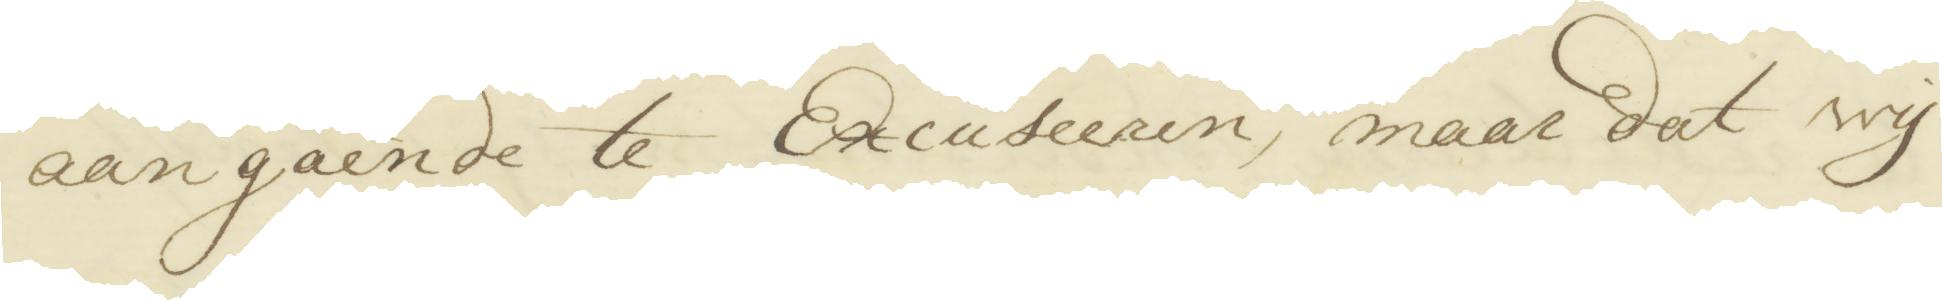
aan gaende te Excuseeren, maar dat wij
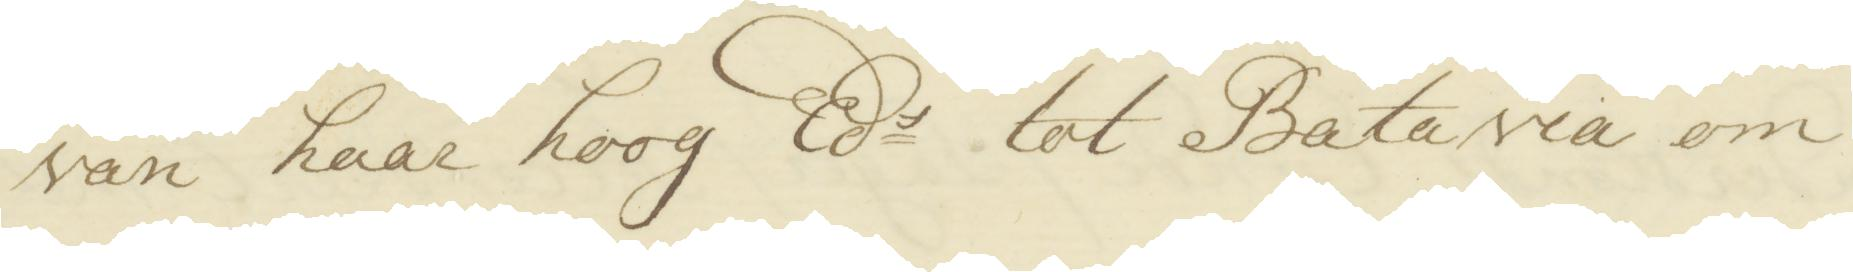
van haar hoog Ed=s tot Batavia om
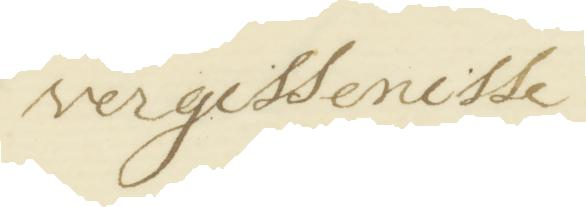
vergissenisse
